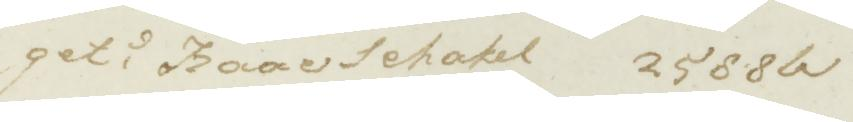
get:' Jzaac schakel 25884
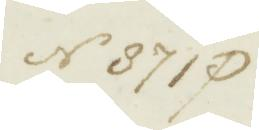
N 871p
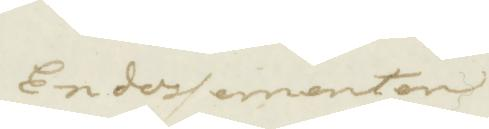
Endessementen
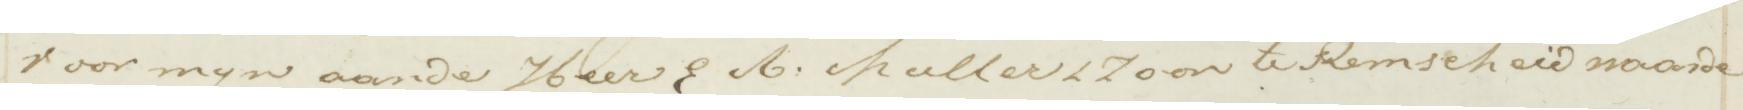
voor myn aan de Heer E A.Muller & zoon te Remscheid waarde
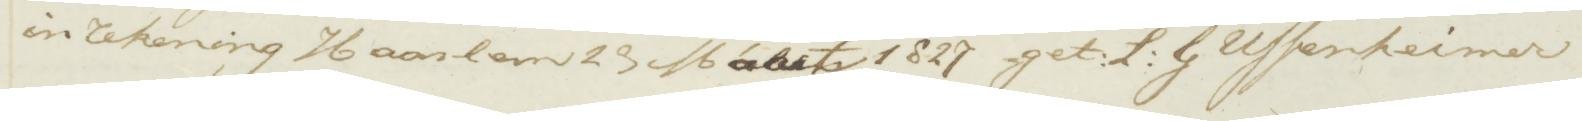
in rekening Haarlem 23 Maart 1827 =get: L: G: Ussemheimer
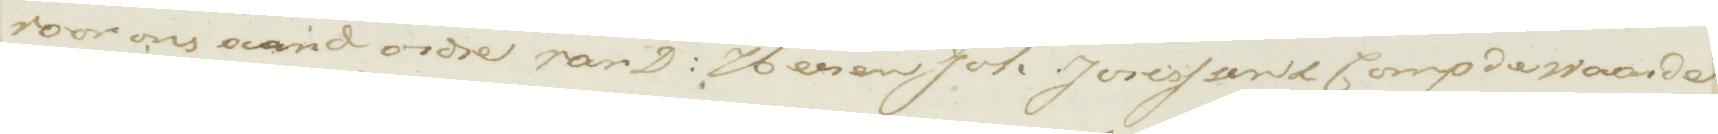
voor ons aan d ordre van D: Heeren Joh Joris Jan & Comp de waarde
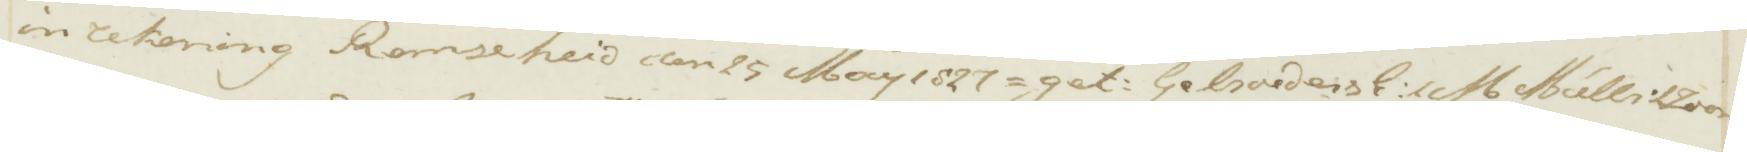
in rekening Remscheid den 25 May 1827 = get: Gebroeders h: & M Muller & Zoone
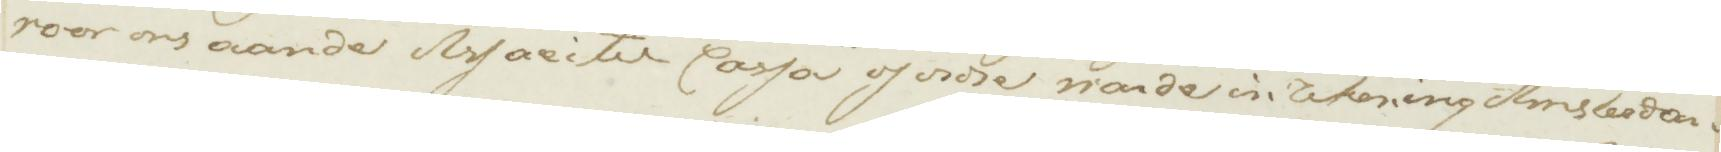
voor ons aan de Associtie Cassa of ordre warde in rekening Amsterdam
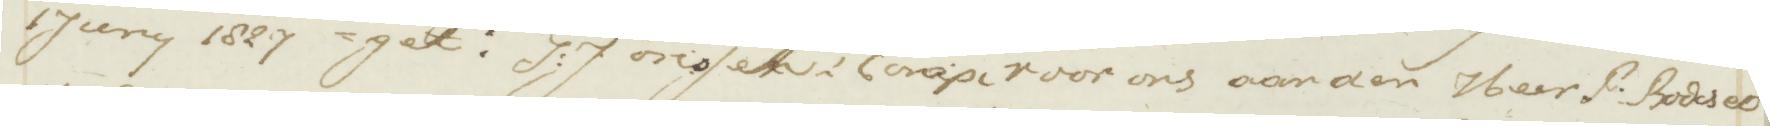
1 Juny 1827 = get: J: Joris Jen: comp voor ons aan den Heer P. Bodisco
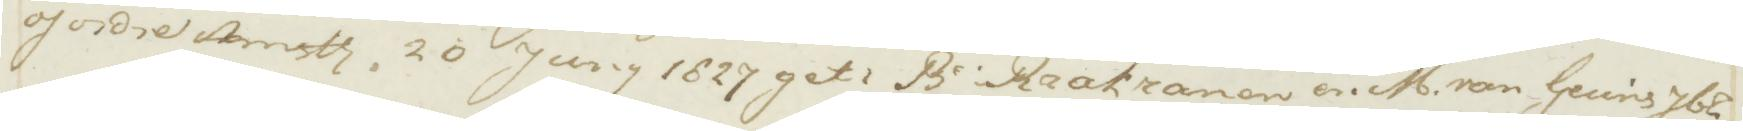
of ordre Amsth, 20 Juny 1827 get: B" Raakranen en M: van Geurs Jbr
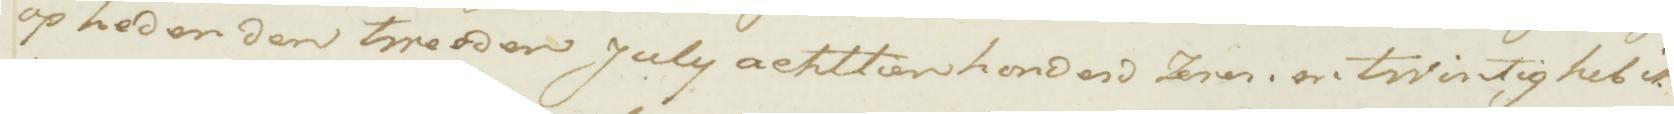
op heden den tweeden July achttien honderd zeven en twintig heb ik qq
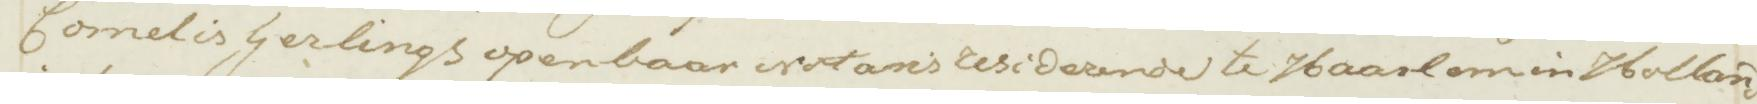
Cornelis Gerlings openbaar Notaris residerende te Haarlem in Holland
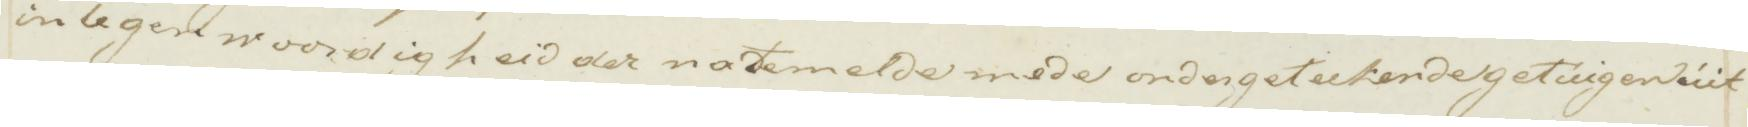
in tegenwoordigheid der natemelde mede ondergeteekende getuigen uit
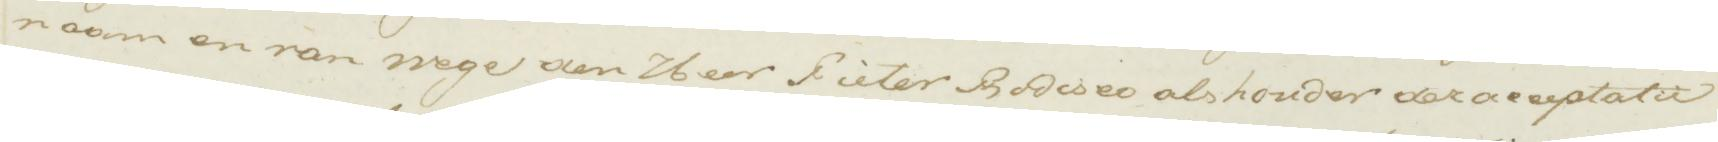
naam en van wege den Heer Pieter Bodisco als houder der acceptatie
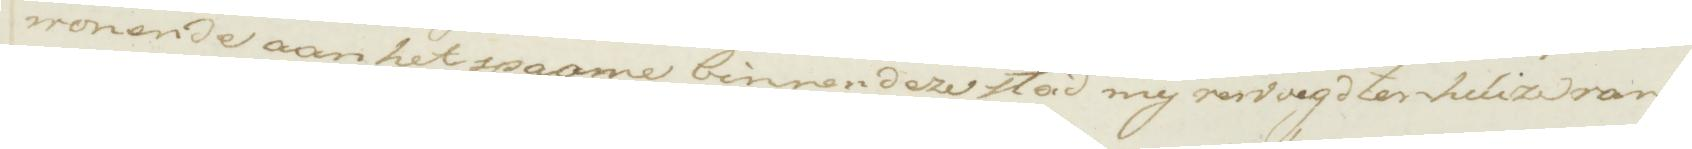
wonende aan het spaarne binnen deze stad my vervoegd ter huize van
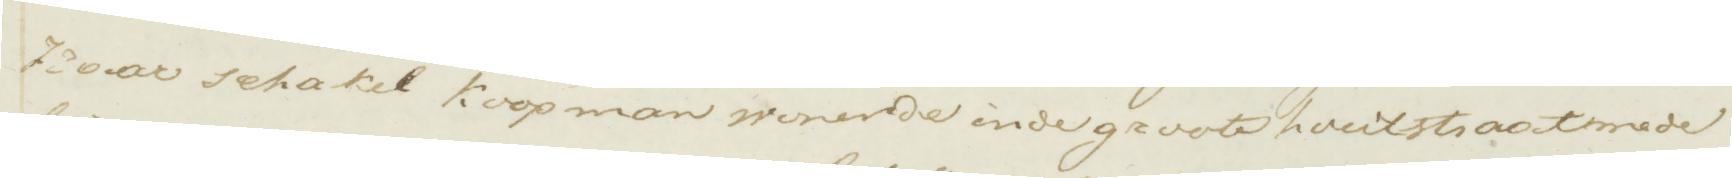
Jzaac schakel koopman wonende inde groote houtstraat mede
